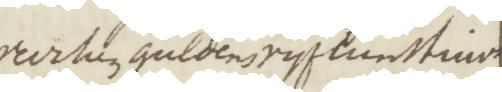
veertien guldens vyftien stuivrs
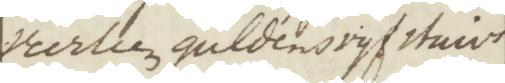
Veertien guldens vijf stuivr
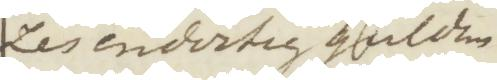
zes endertig guldens
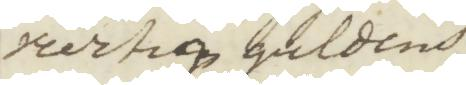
veertig guldens
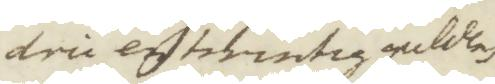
drie en twintig guldens
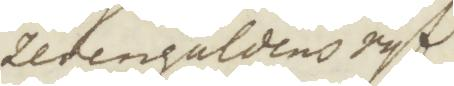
zeven guldens vyf
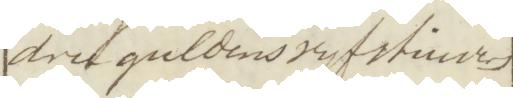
drie guldens vyf stuivers
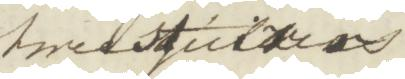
twee sguldens
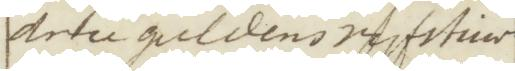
drie guldens vyf stuiv
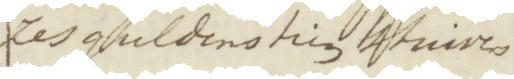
zes guldens tien Stuivers
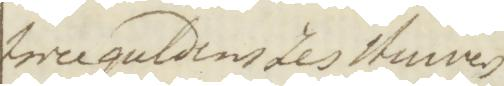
twee guldens zes stuivers
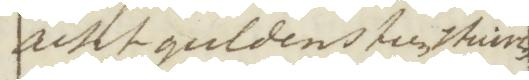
acht guldens tien stuiver
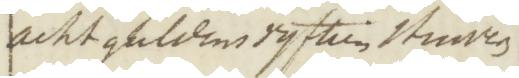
acht guldens vijftien stuivers
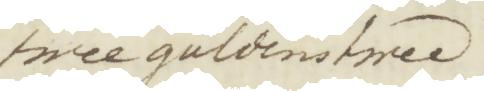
twee guldens twee
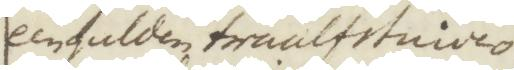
een gulden twaalf stuivers
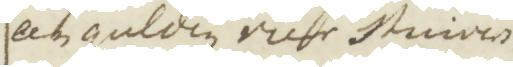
een gulden vier stuivers
